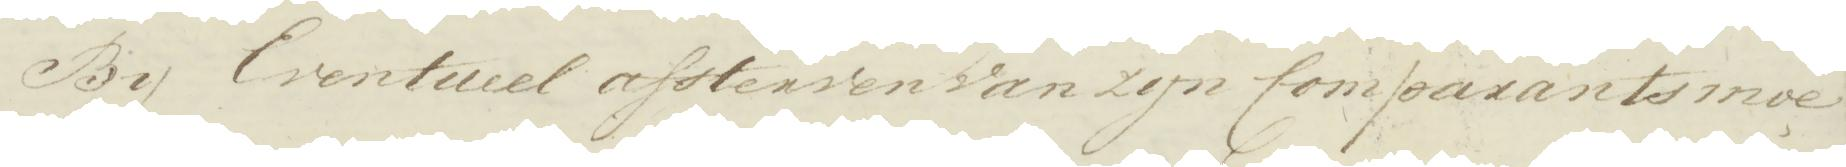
By Eventueel afsterven van zijn comparants moe„
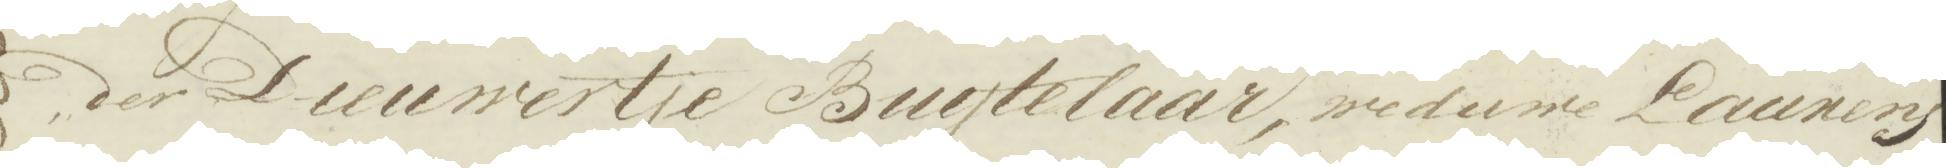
„der Dieuwertje Bugtelaar, weduwe Laurens
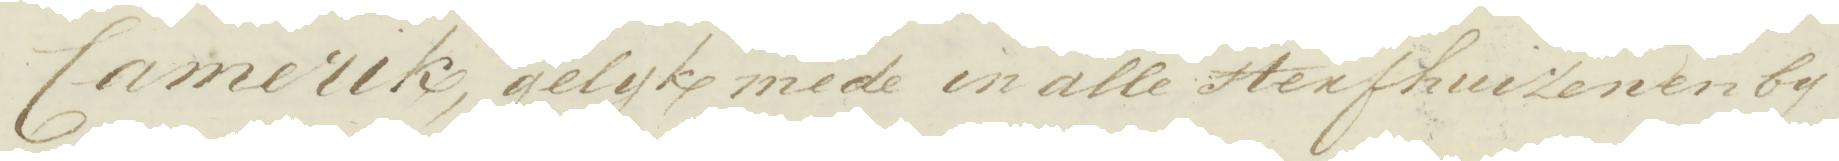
Camerik, gelyk mede in alle sterfhuizen en by
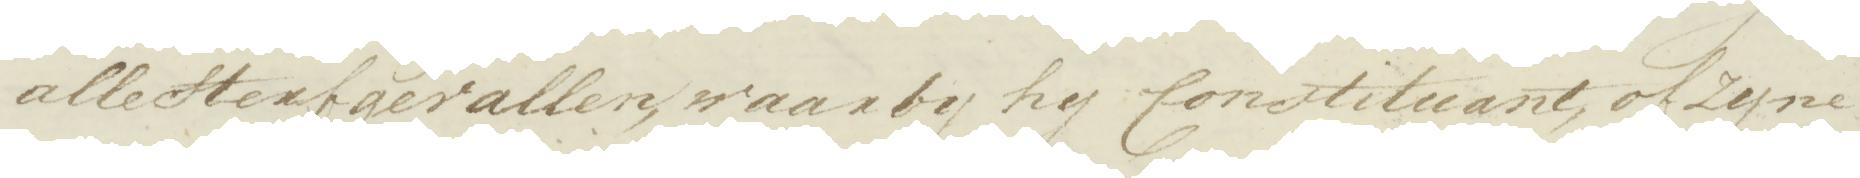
alle sterfgevallen, waarby hy constituant, of zyne
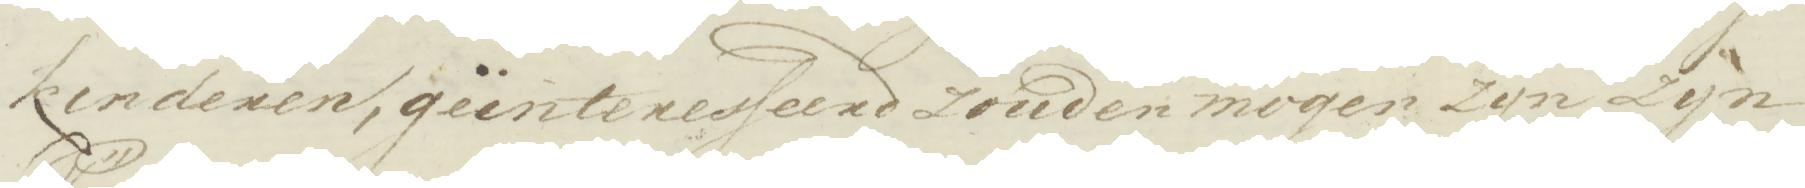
kinderen, geinteresseerd zouden mogen zyn, zyn
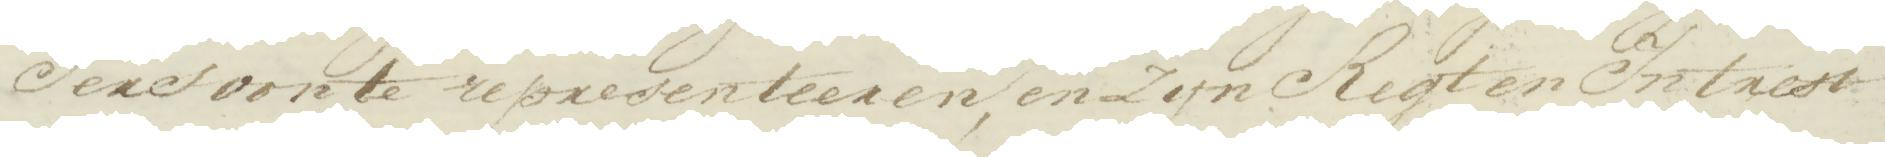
Persoon te representeeren, en zyn Regt en Intrest
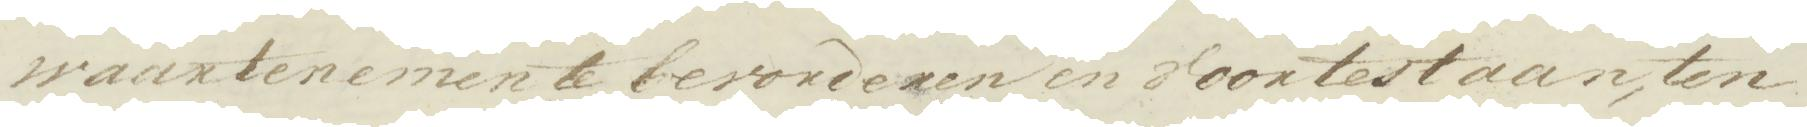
waar tenemen te bevorderen en voor testaan, ten
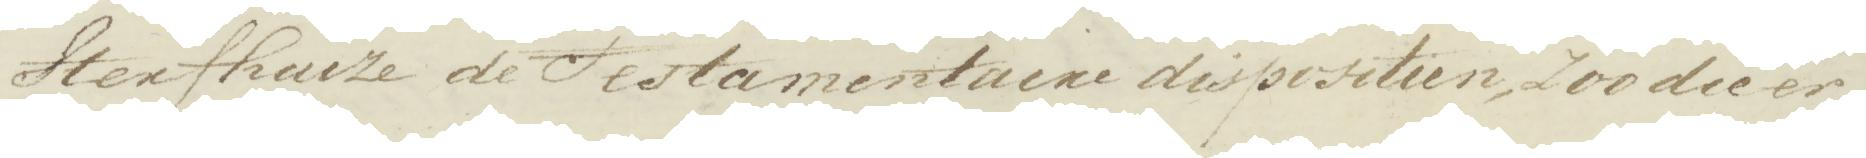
sterfhuize de Testamentaire dispositien, zoo die er
